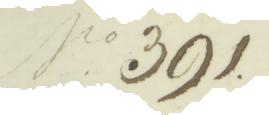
N.ro 391.
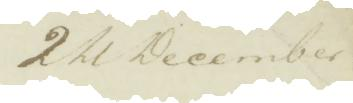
24 December
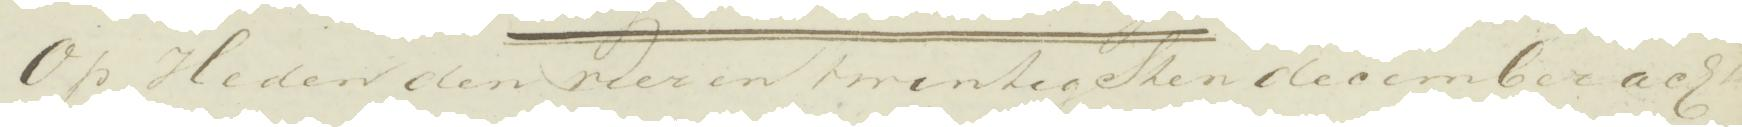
op Heden den vier en twintigsten december acht
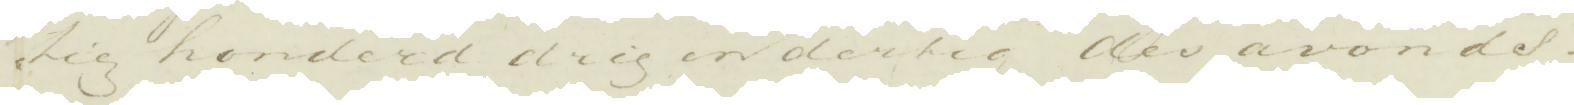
„tien honderd drie en dertig des avonds
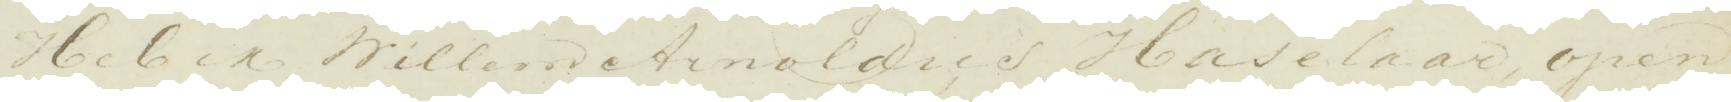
Heb ik Willem Arnoldus Haselaar, open
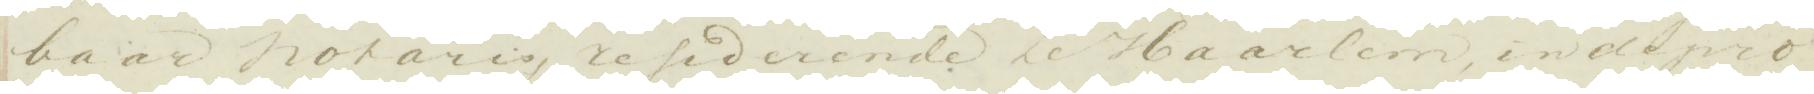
baar Notaris, residerende te Haarlem, in de pro
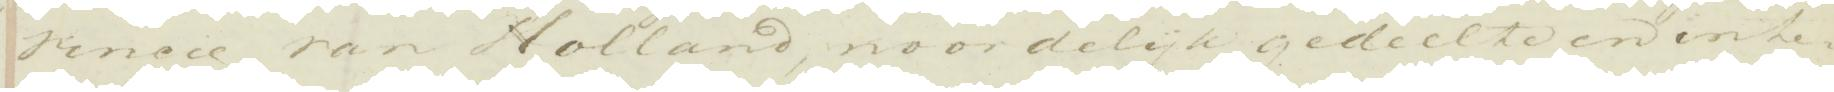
vincie van Holland, noordelijk gedeelte en in te
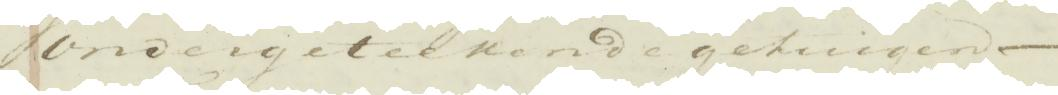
ondergeteekende getuigen.—
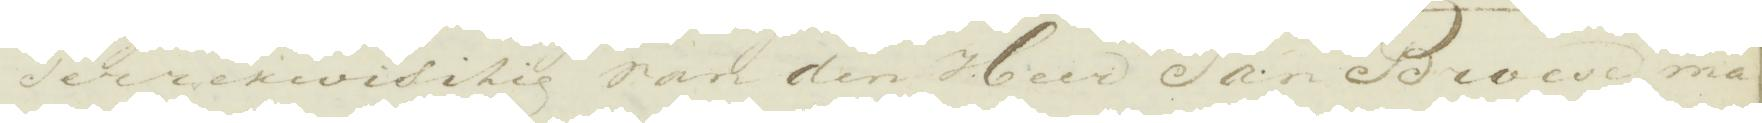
Ter rekwisitie van den Heer Ian Broese ma
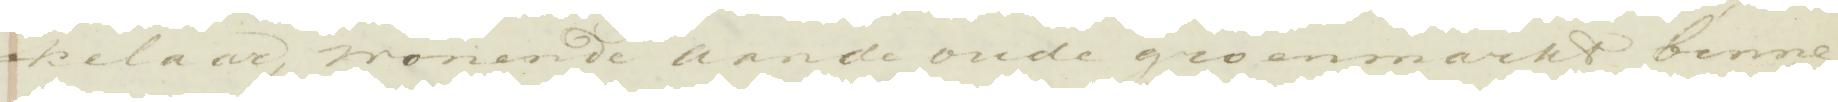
„kelaar, wonende aan de oude groenmarkt binnen
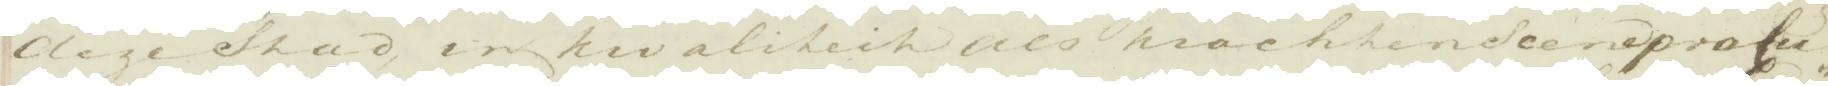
deze Stad, in kwaliteit als krachtens eene procu
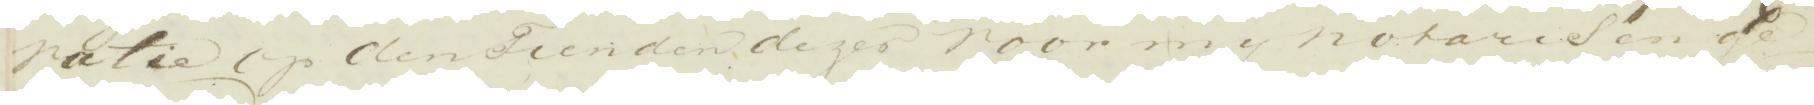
ratie op den Tienden dezer voor my notaris en ge
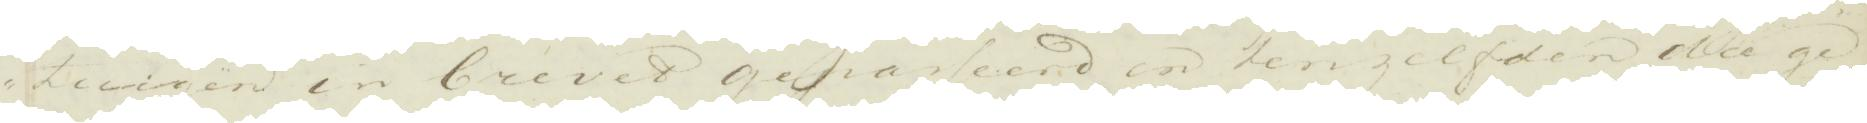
tuigen in brevet gepasseerd en ten zelfden dage
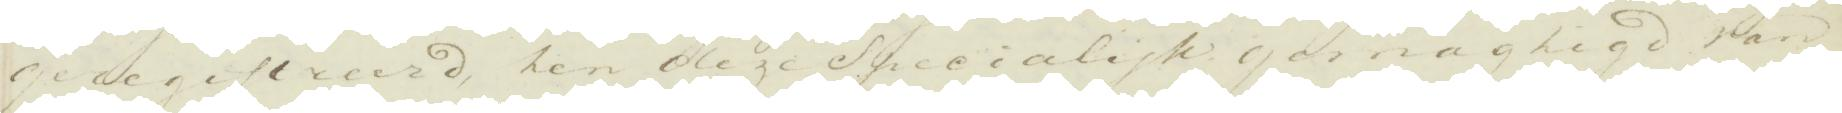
geregistreerd, ten deze specialijk gemagtigd van
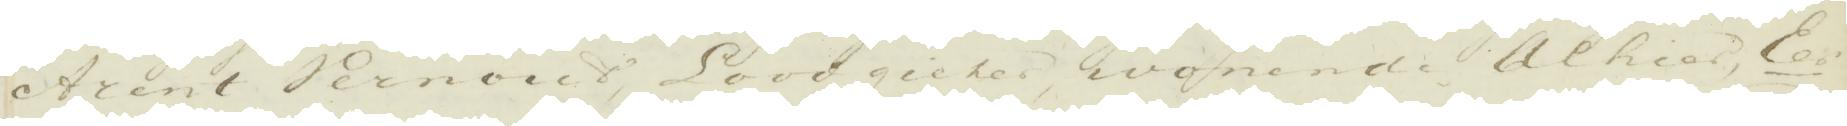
Arent Vernout, Loodgieter, wonende Alhier, Eer
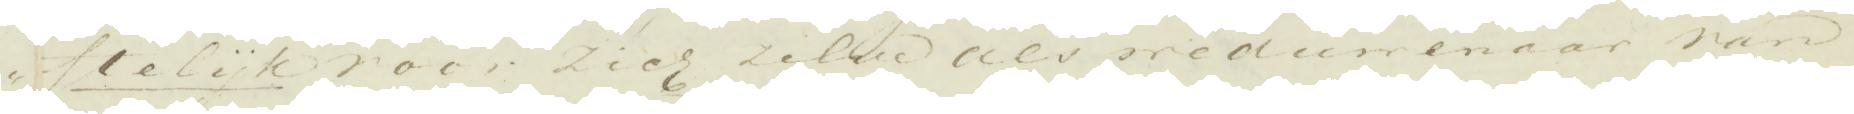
„stelijk voor zich zelve als weduwenaar van
